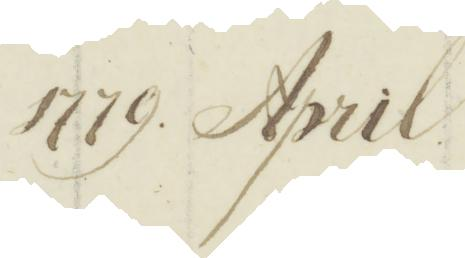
1779. April
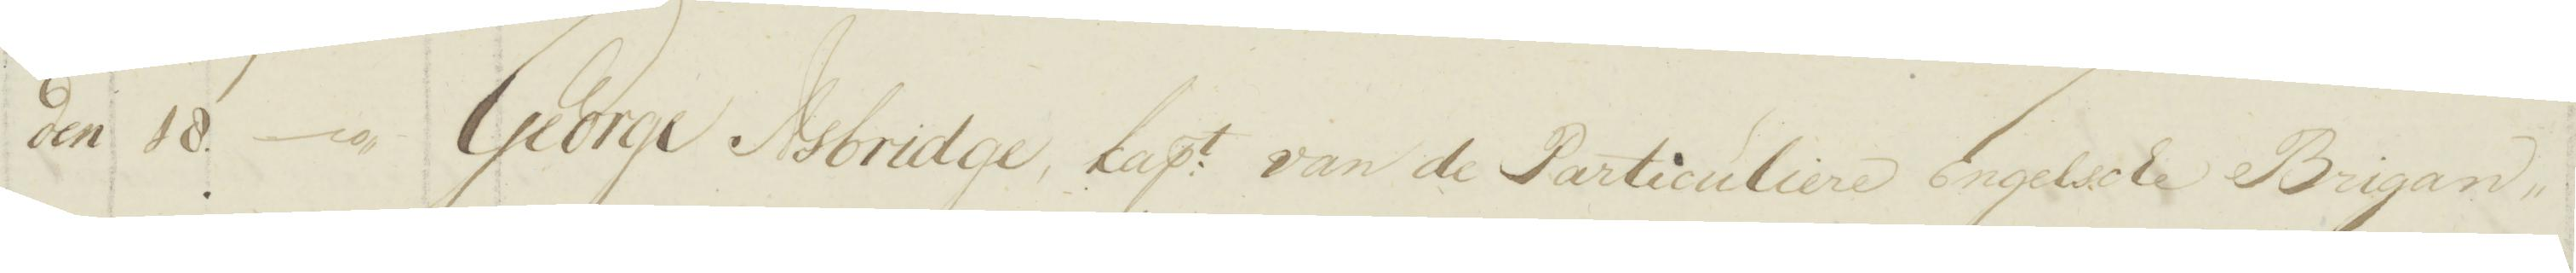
den 18. _„o George Asbridge, kap:t van de Particuliere Engelsche Brigan„
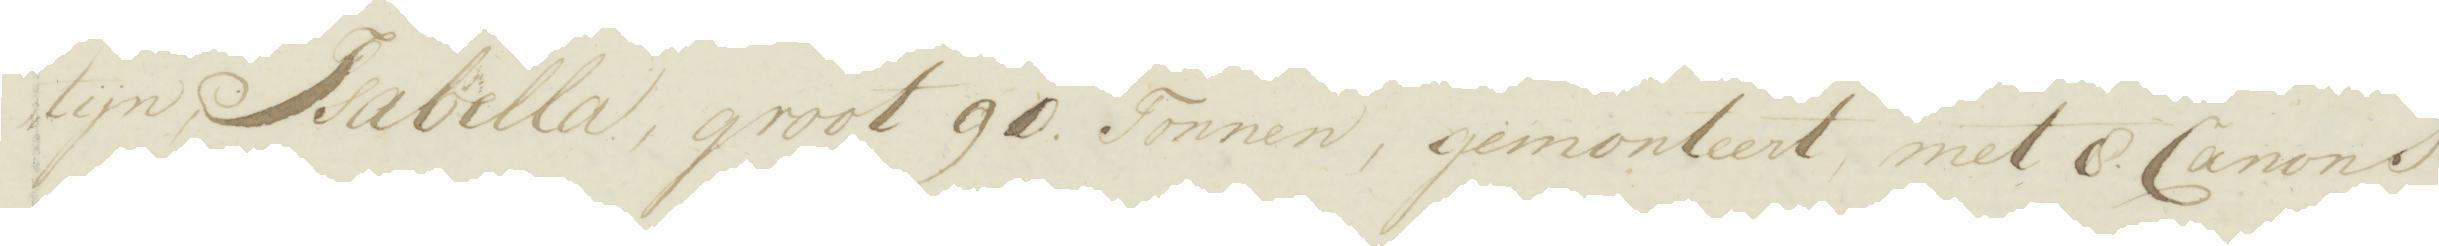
„tijn, Isabella, groot 90. Tonnen, gemonteert, met 8. Canons
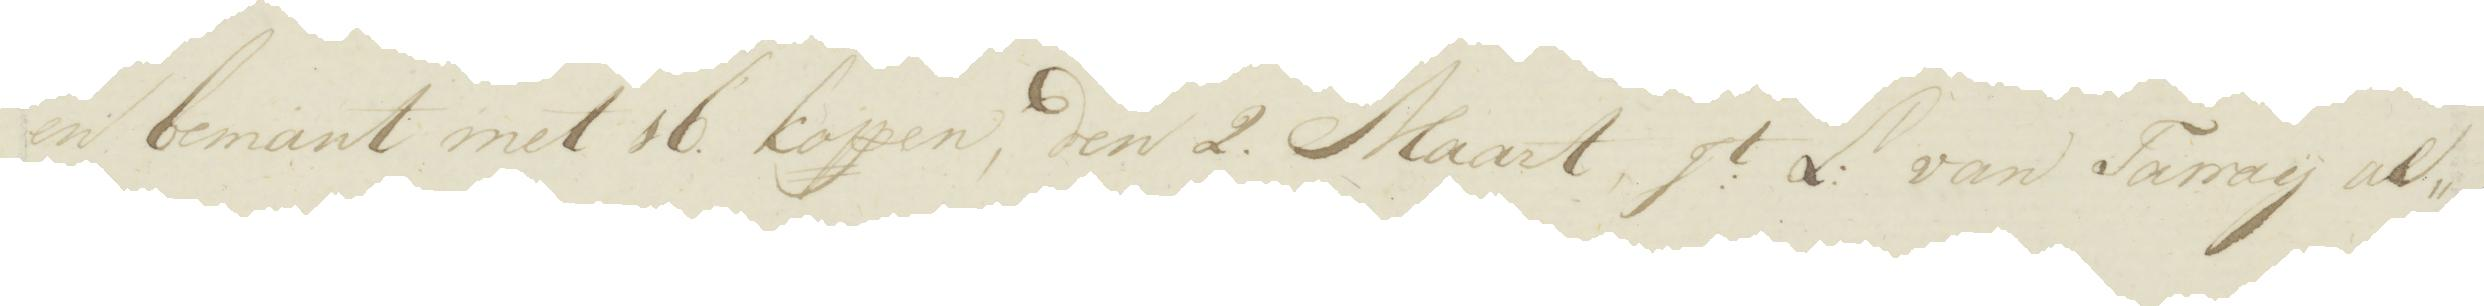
en bemant met 16. koppen, den 2. Maart, J:t L: van Tawaij al„
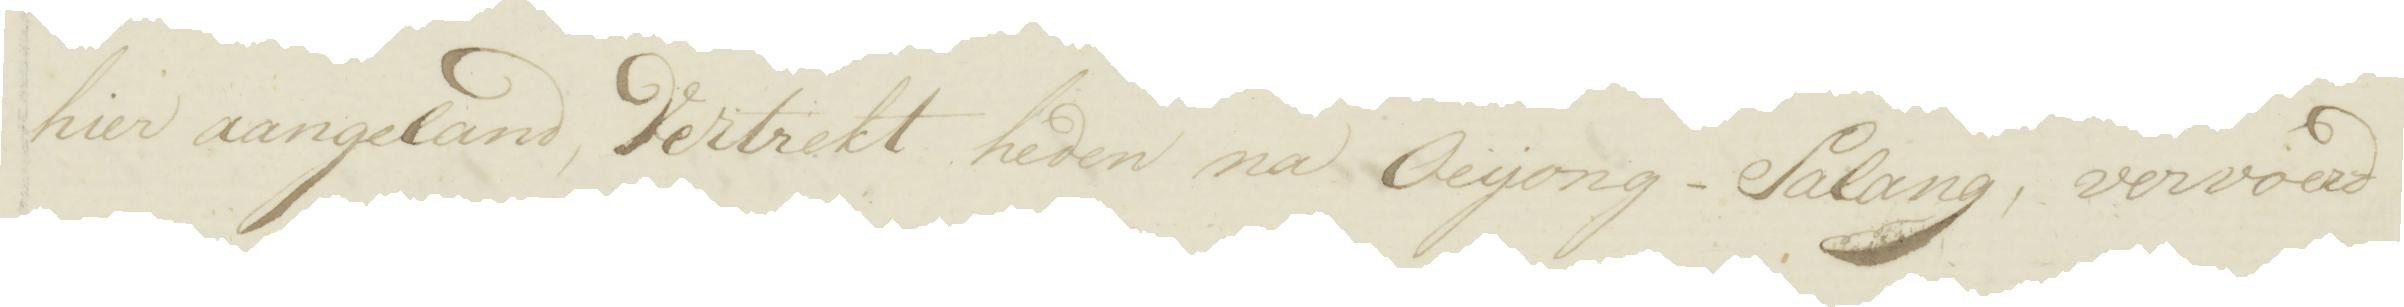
hier aangeland, vertrekt heden na Oeijong-Salang, vervoerd
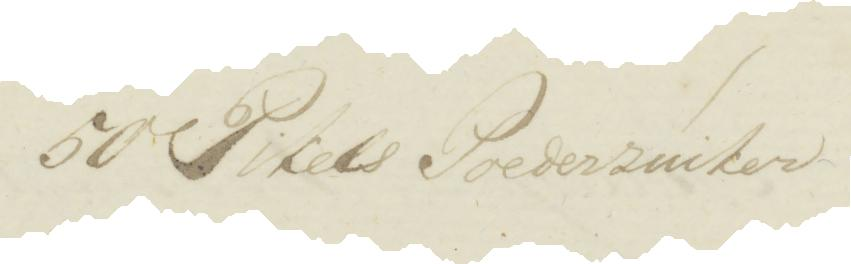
50 Pikels Poederzuiker
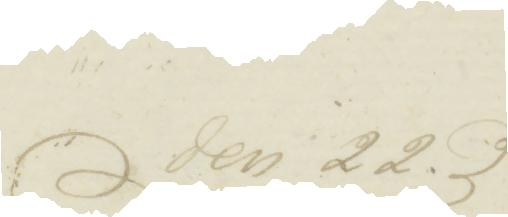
den 22.
